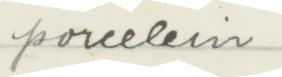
porcelein
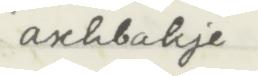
aschbakje
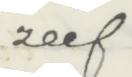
zeef
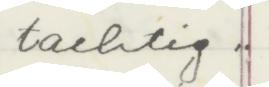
tachtig „
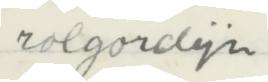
rolgordijn
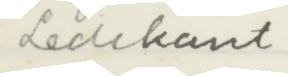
Ledikant
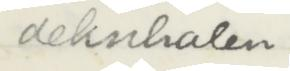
dekschalen
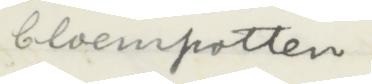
bloempotten
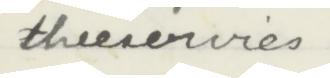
theeservies
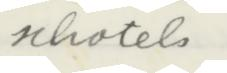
schotels
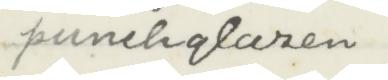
punchglazen
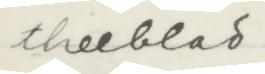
theeblad
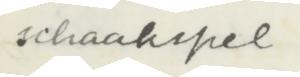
schaakspel
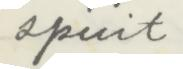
spuit
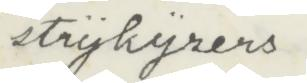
strijkijzers
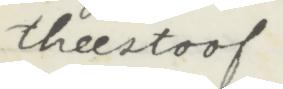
theestoof
